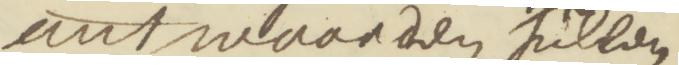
antwoorden sullen
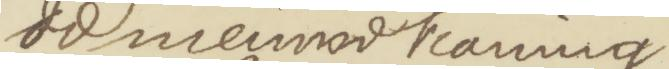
de nieuwe koning
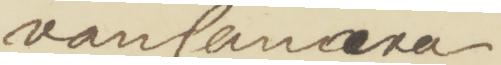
van Canara
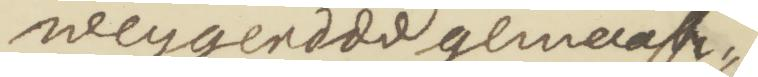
weijgerdde gemaak„
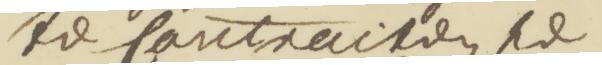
te Contracten te
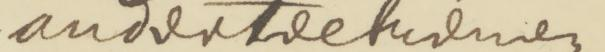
onderteekenen
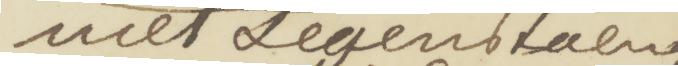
niet tegenstaen
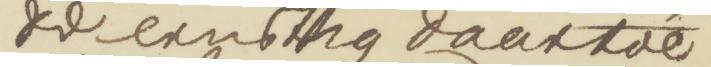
de ernstig daartoe
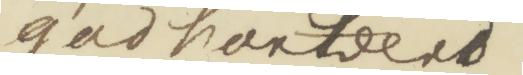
g'adhorteerd
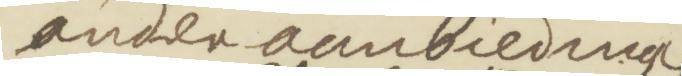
onder aanbieding
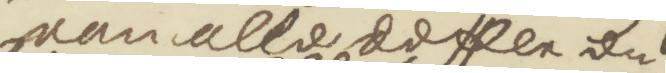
van alle de pper en
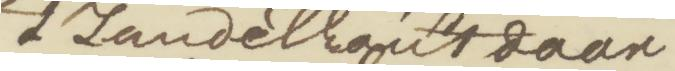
't Zandelhout daar
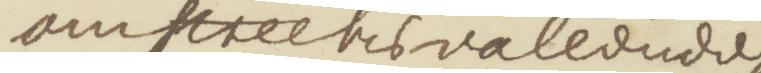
omstreeks vallende
